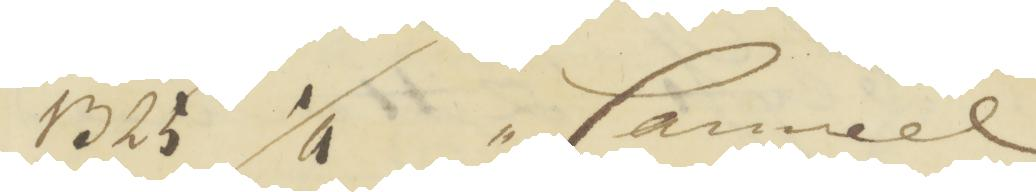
1325 ¼ „ Canneel
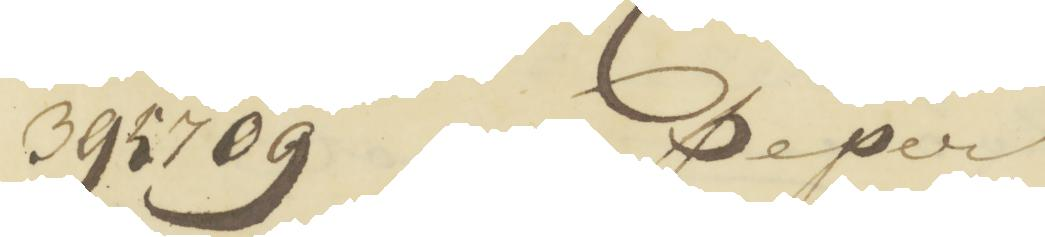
395709 „ peper
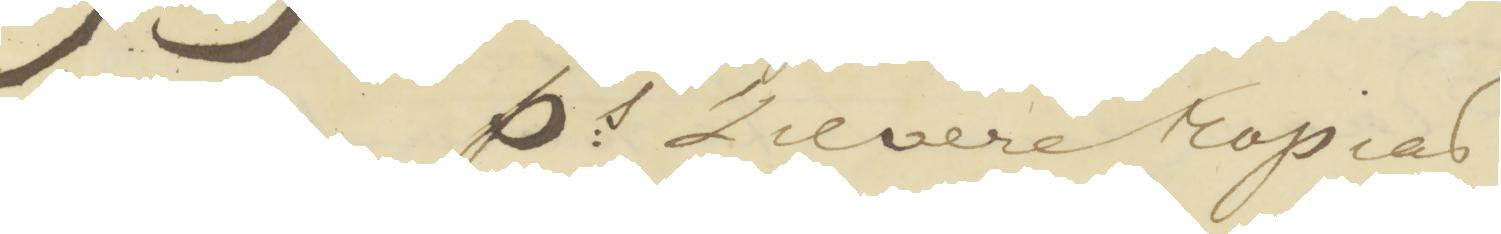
109380. p:s zilvere ropias
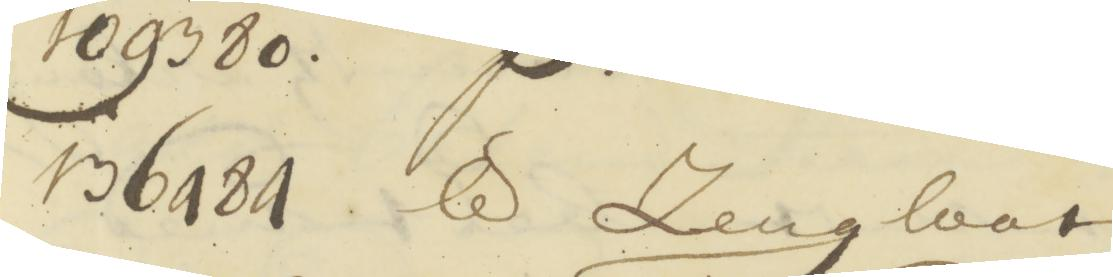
136484 lb zeng loot
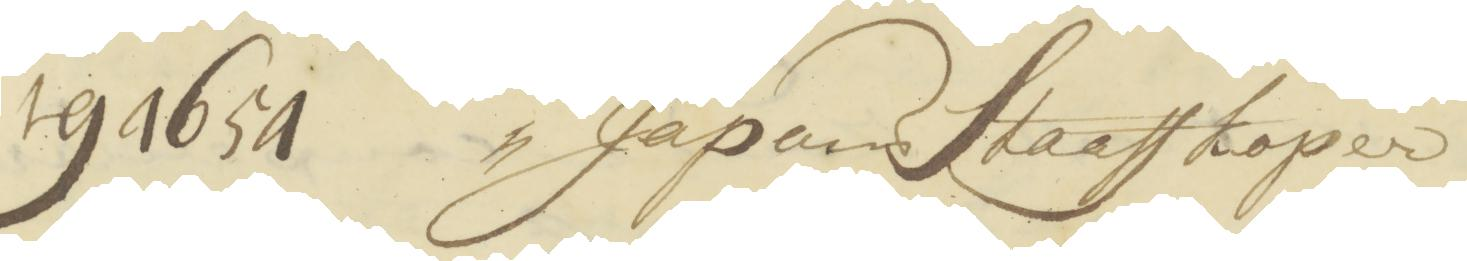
194654 „ Japans Staaffkoper
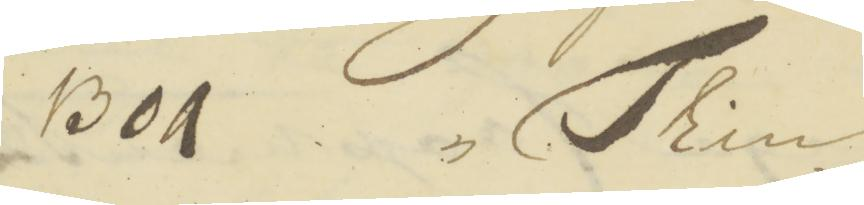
1304 „ Thin
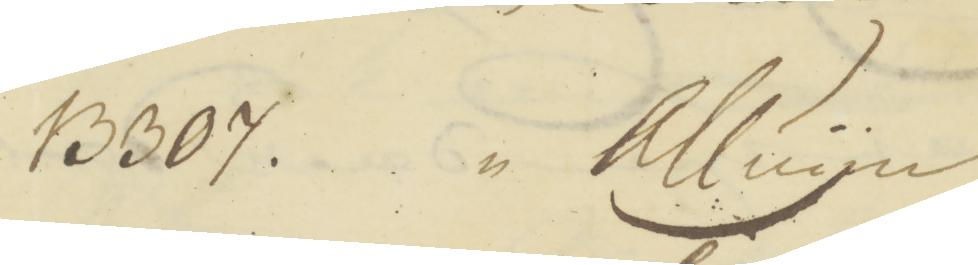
13307. „ Alluijn
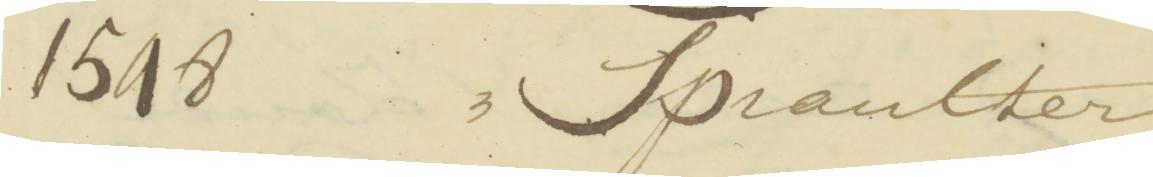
1548 „ Spiaulter
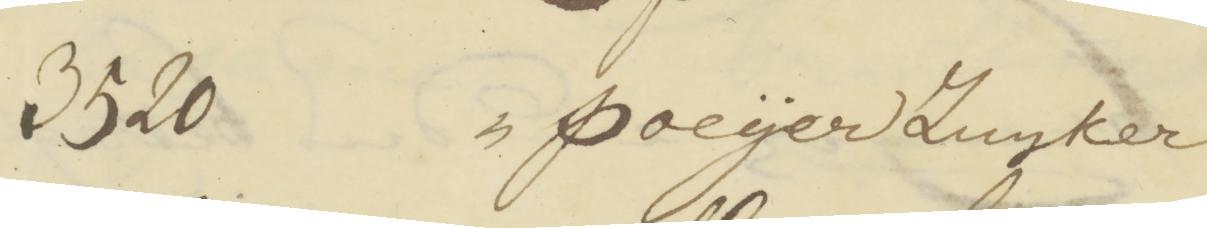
3520 „ poeijer zuyker
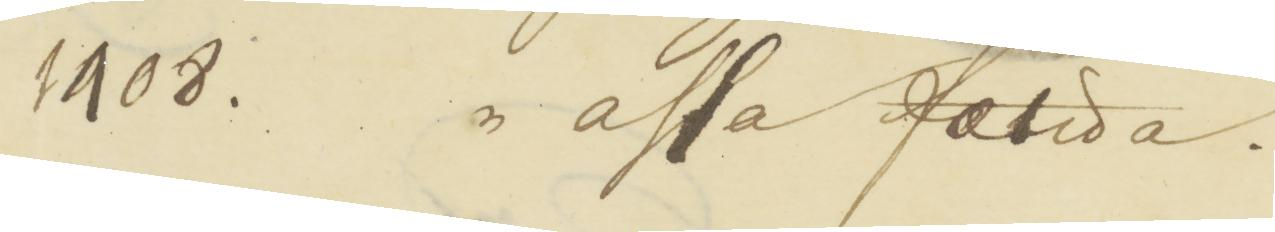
1408. „ assa fatida.
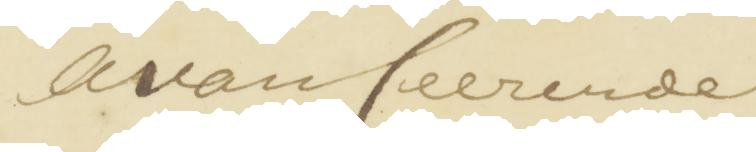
avanceerende
